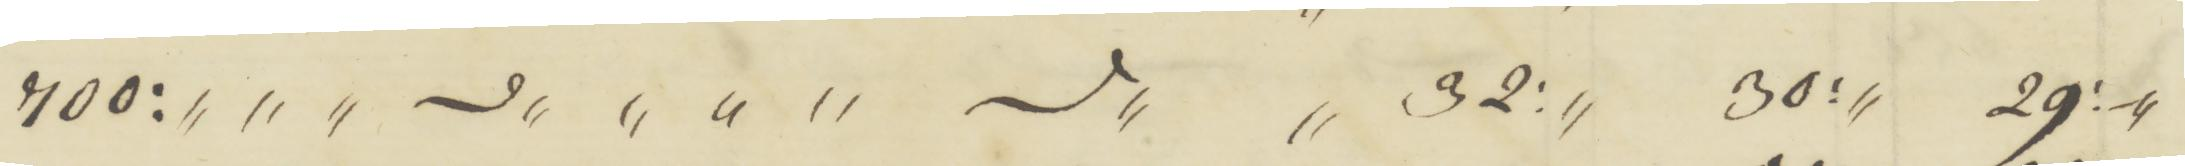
700: „ „ „ d„ „ „ „ d„ „ 32: „ 30: „ 29: —„
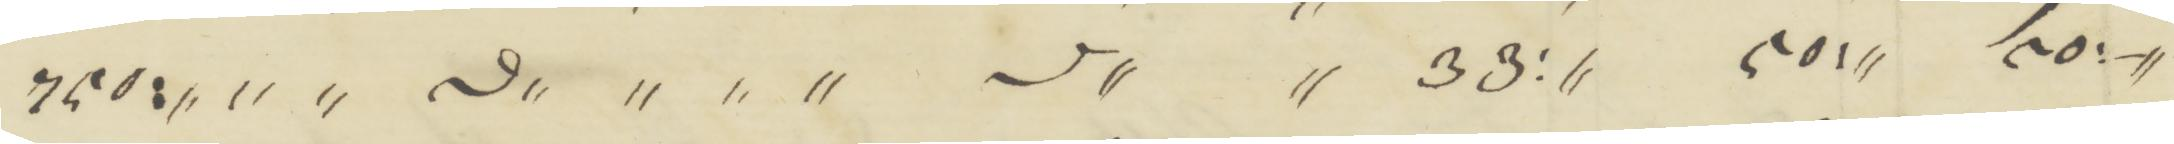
750: „ „ „ d„ „ „ „ d„ „ 33: „ 50: „ 50: —„
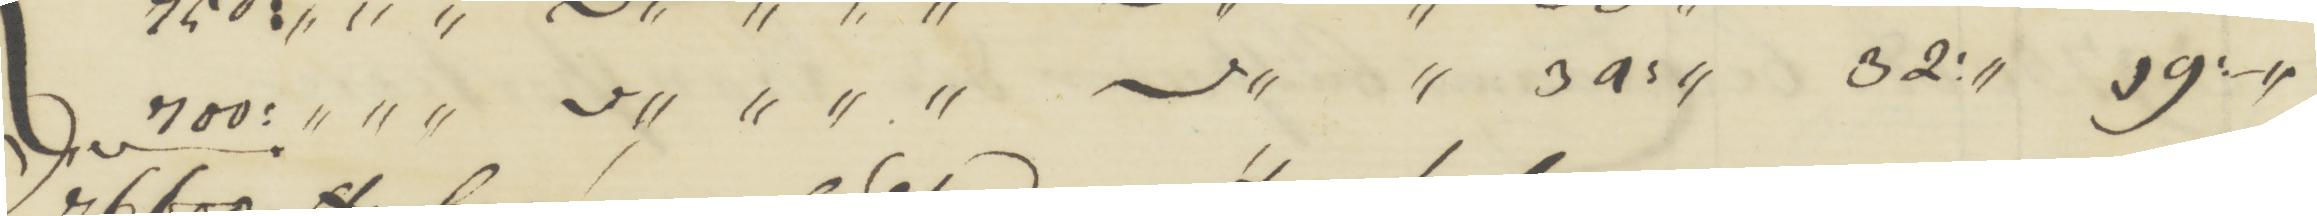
700: „ „ „ d„ „ „ „ d„ „ 34: „ 32: „ 19: —„
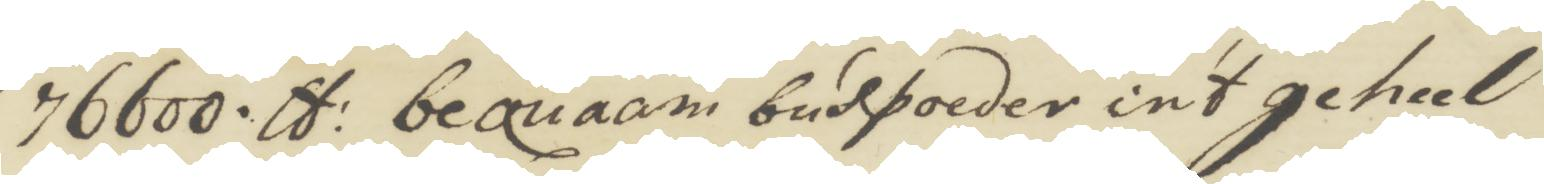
76600. lb: bequaam buspoeder in ’t geheel
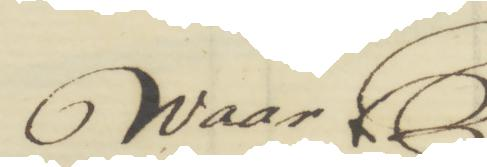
waar xxx
